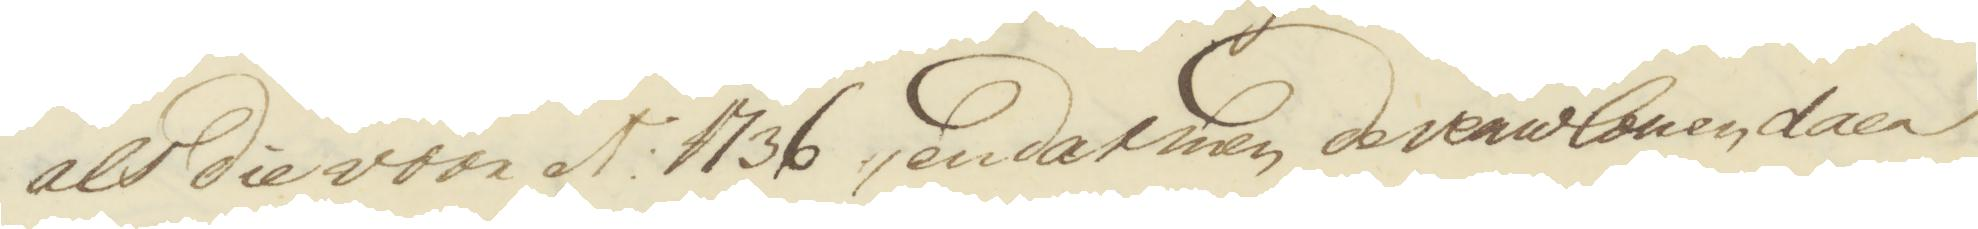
als die voor A:o 1736, en dat men de verwlonen daer
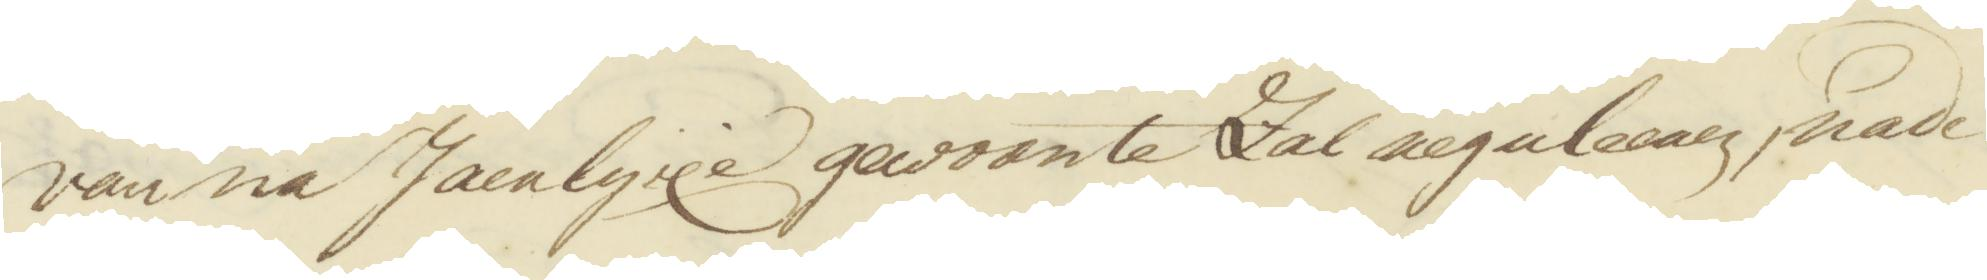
van na Jaerlijxe gewoonte zal reguleeren, nade
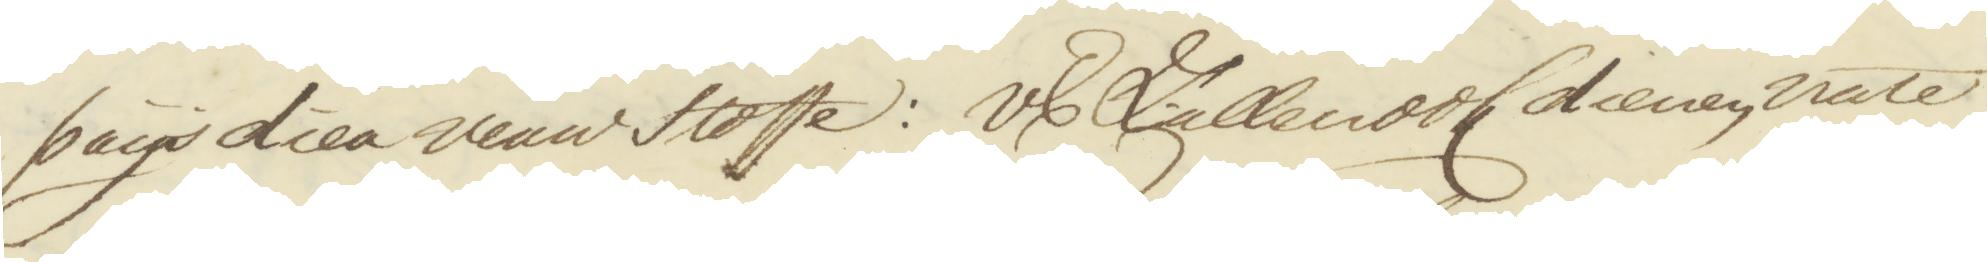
paijs dier verwstoffe: uE zullen ook dienen nate
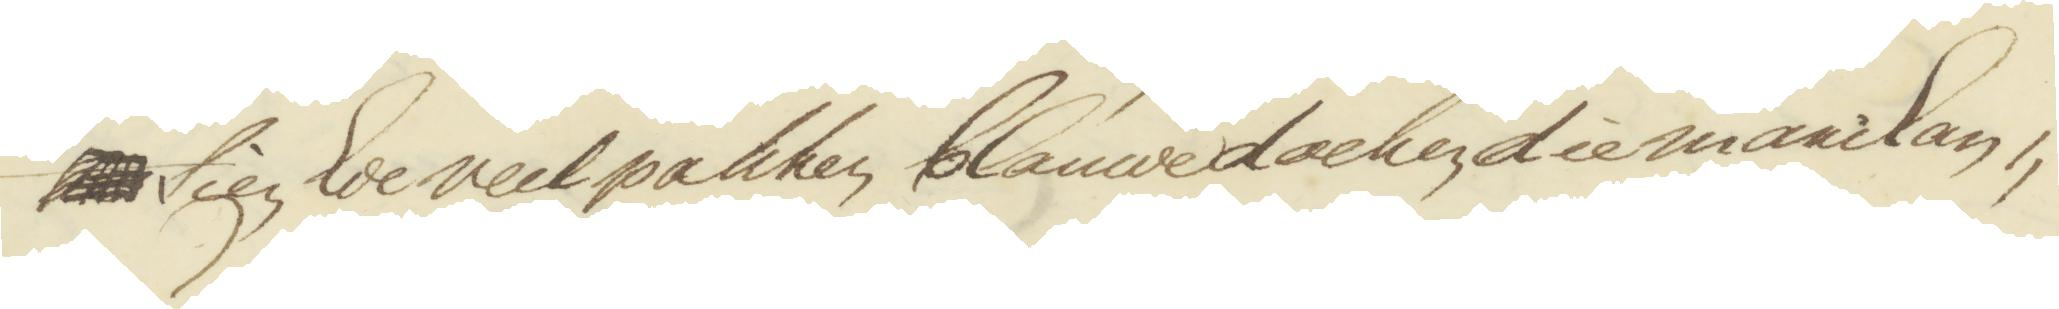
sien hoe veel pakken blauwe doeken die marchan„
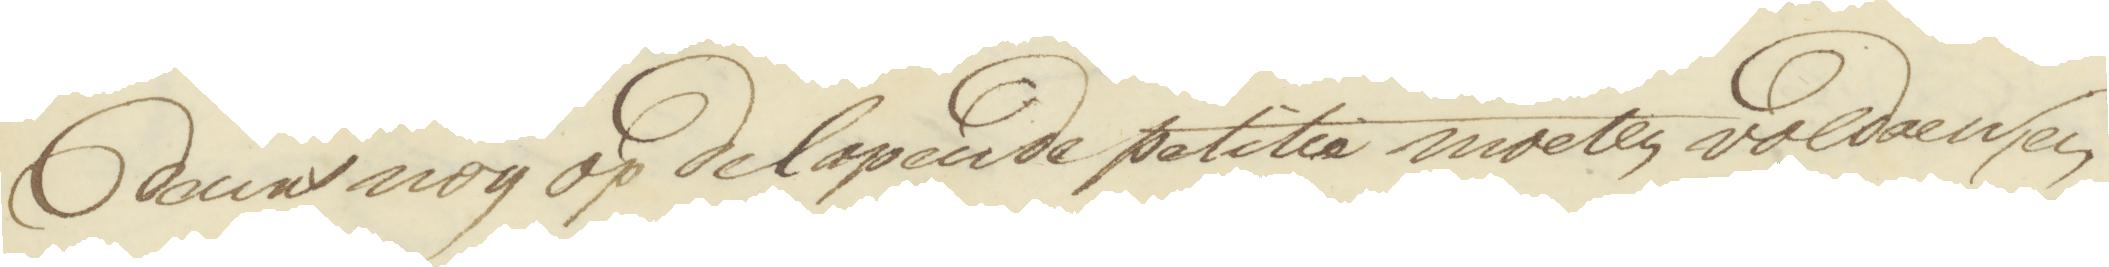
deurs nog op de lopende petitie moeten voldoen, en
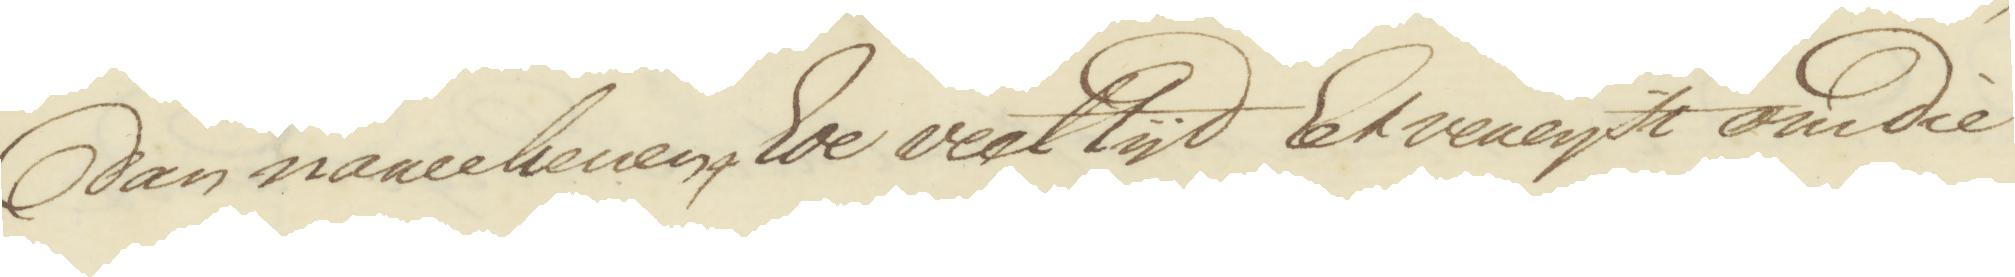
dan nareekenen, hoe veel tijd het vereijst om die
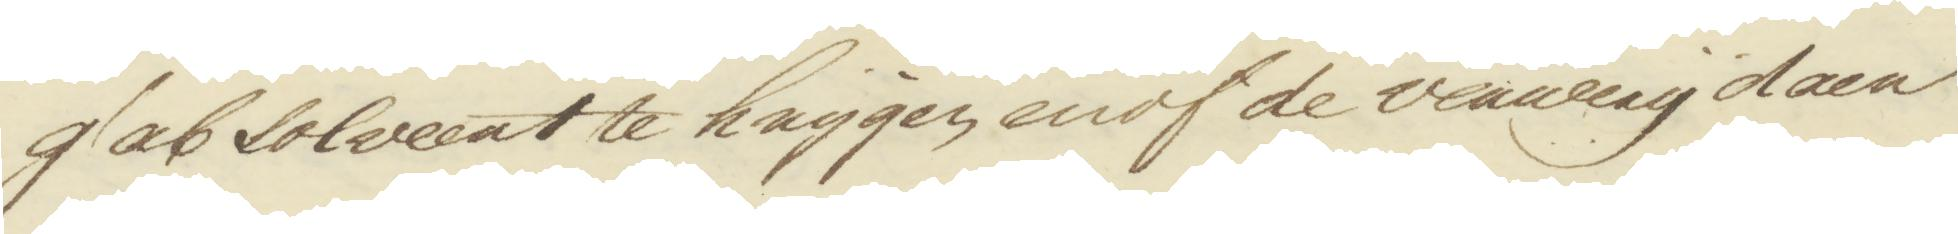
g'absolveert te krijgen en of de verwerij daer
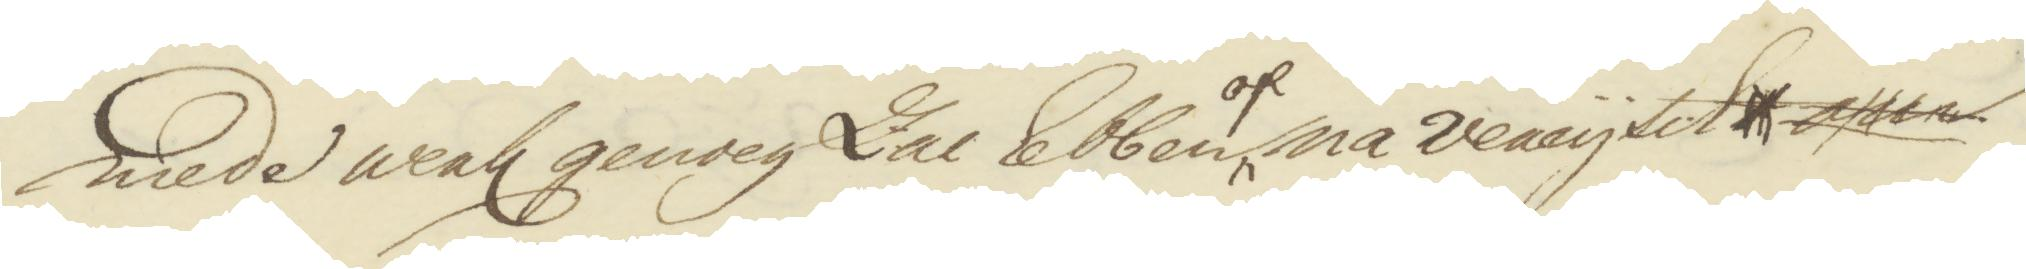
mede werk genoeg zal hebben ^op na vereijscht
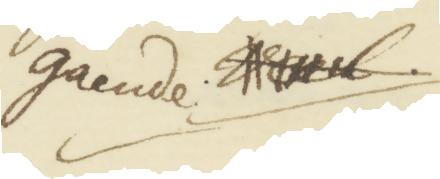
gaende
